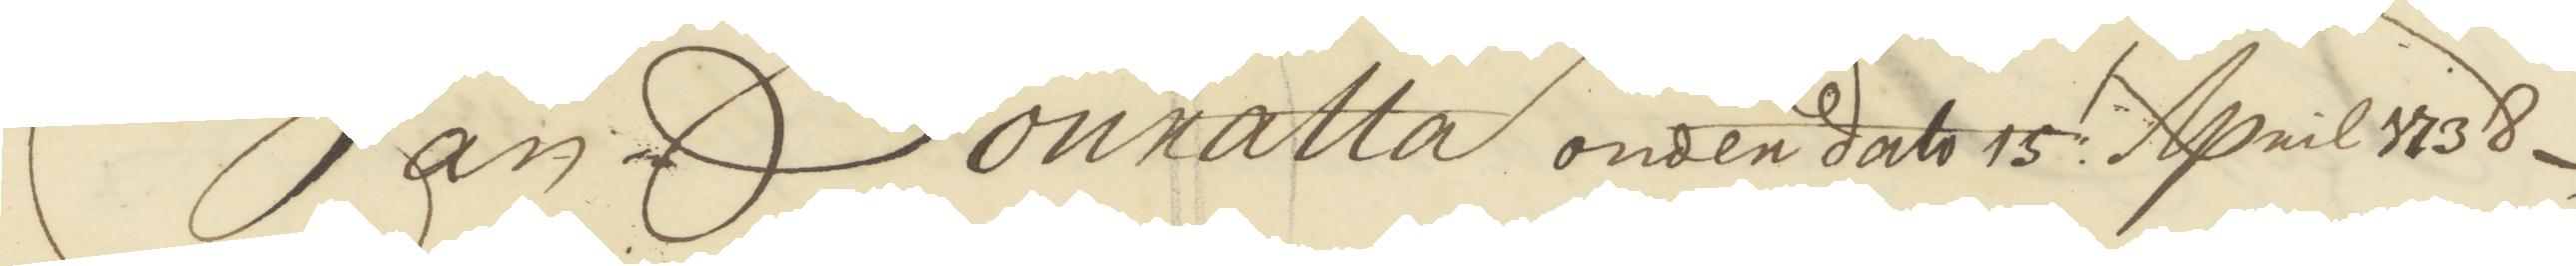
Van Souratta onder dato 15:' April 1738 —
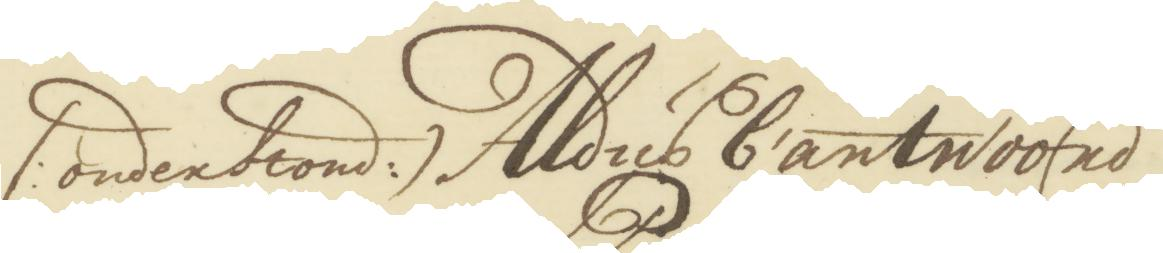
(:onderstond:) Aldus b'antwoord
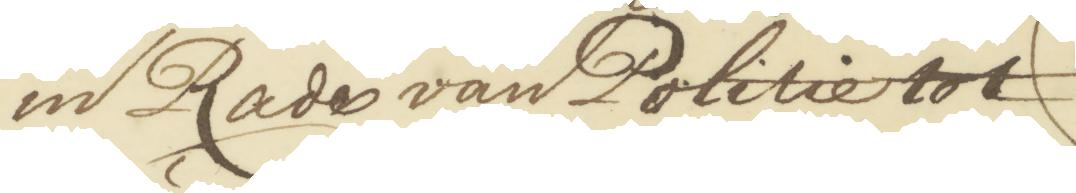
in Rade van Politie tot
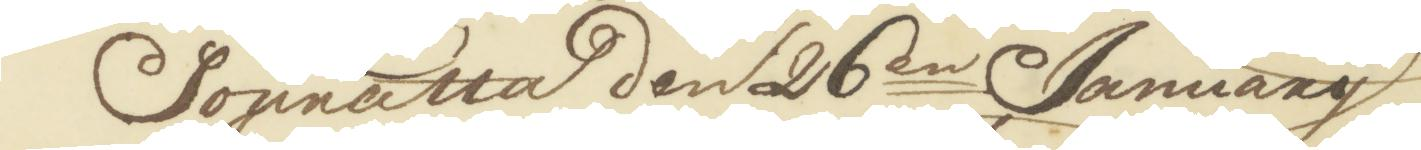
Souratta den 26=en Ianuarij
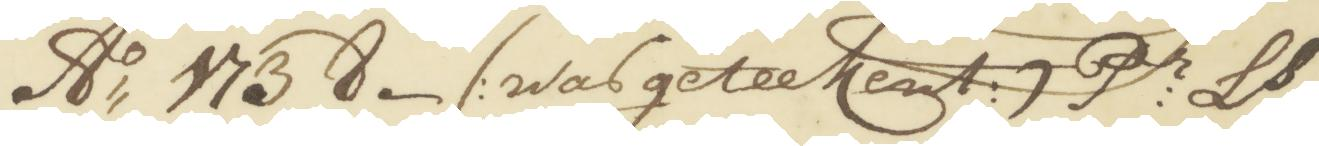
A„o 1738— (:was geteekent:) P:r L:s
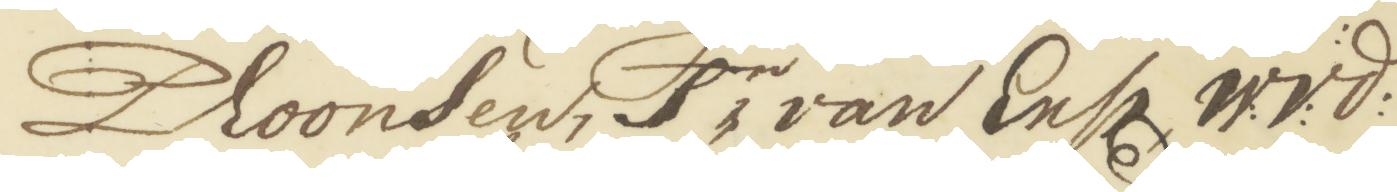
Phoonsen, S„n van Erp W:V:D:
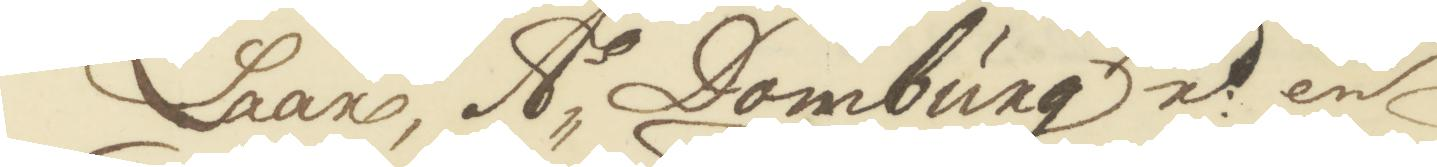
Laar, A„o Domburg r:d en
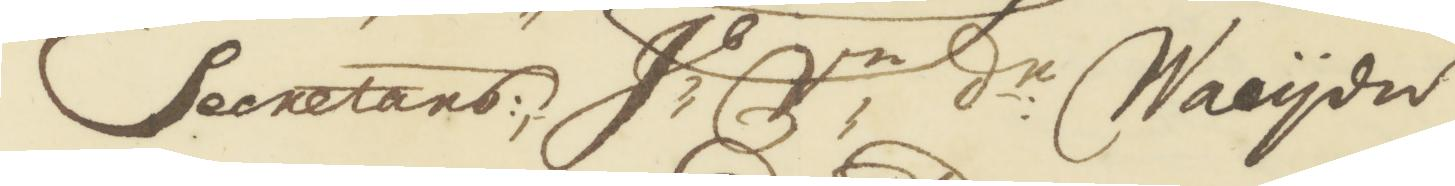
Secretars:, J„s V„n d-:r Waeijen
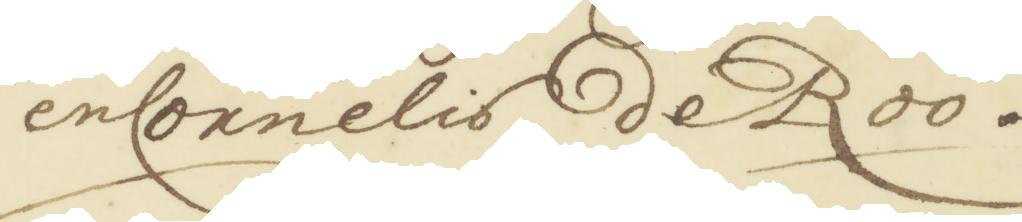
en Cornelis de Roo —
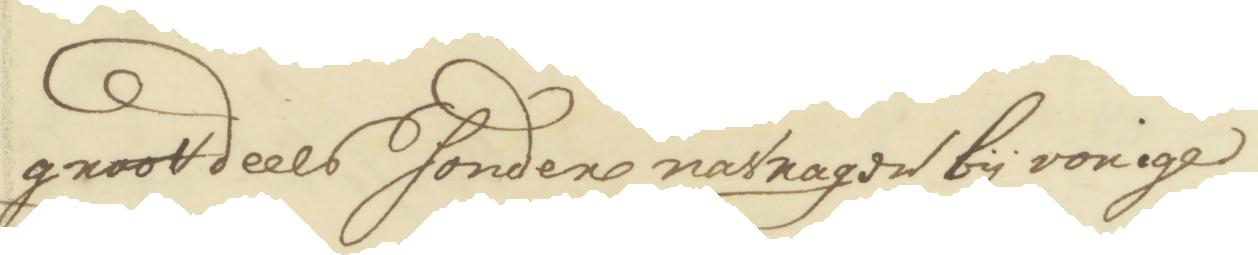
grootdeels sonder navragen bij vorige
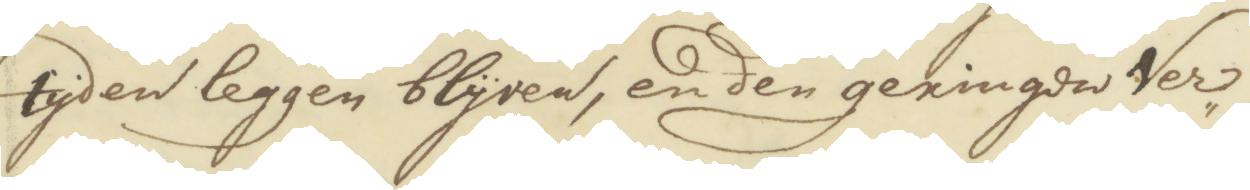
tijden leggen blijven, en den geringen Ver„
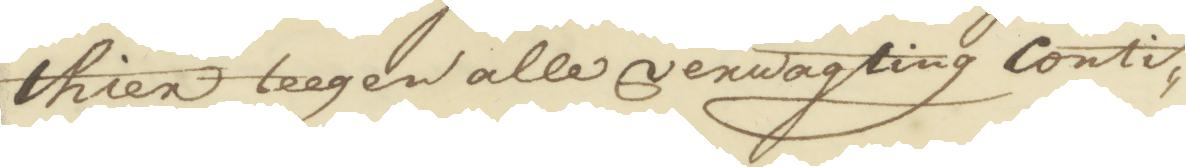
thier teegen alle verwagting conti„
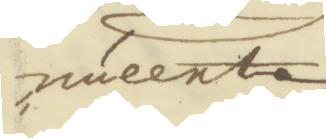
„nueerte
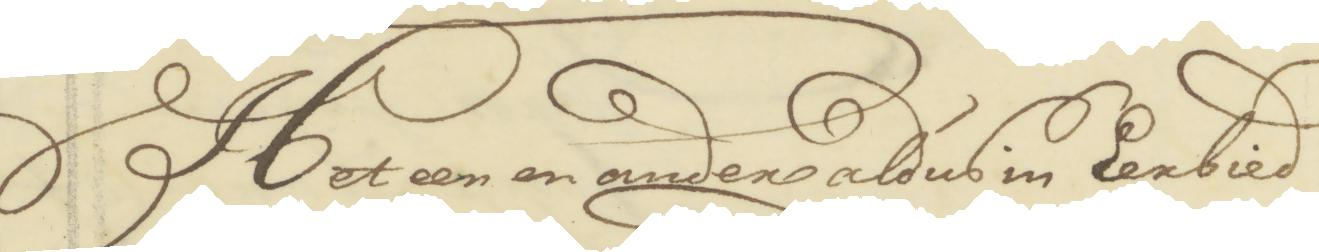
Het een en ander aldus in Eerbied
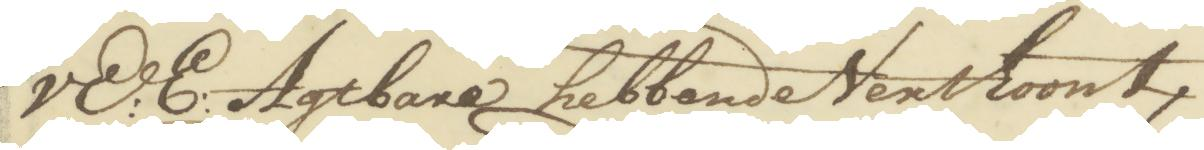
VE: E: Agtbare hebbende Verthoont,
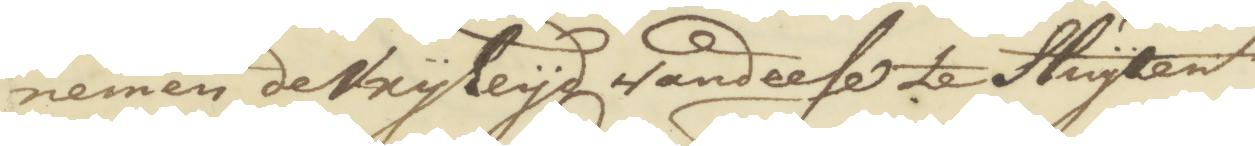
nemen de Vrijheijd vandeese te stuijten
